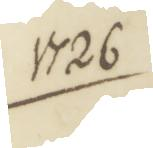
1726
